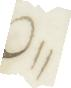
6„
